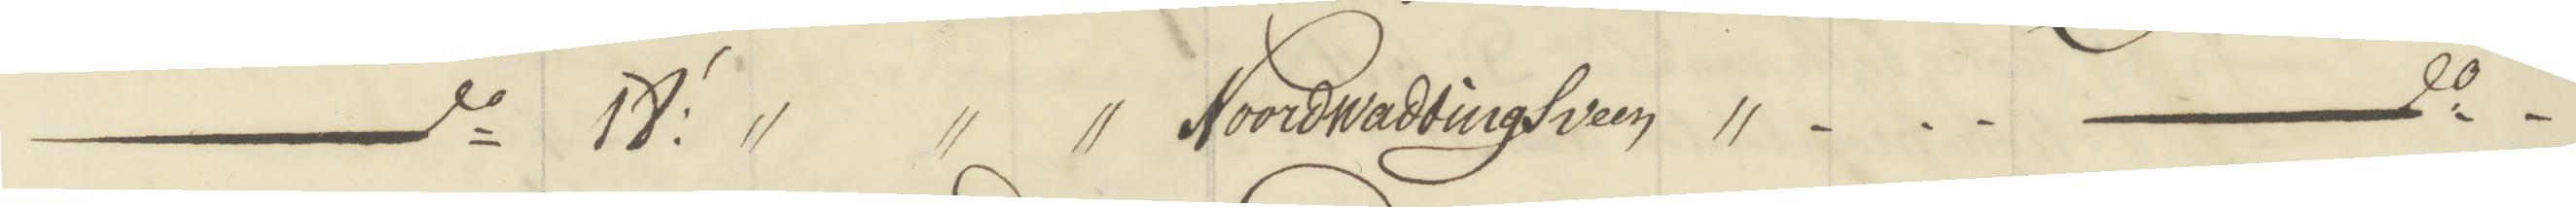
_=o 18:' „ „ „ Noordwaddingsveen „ - . - _:o
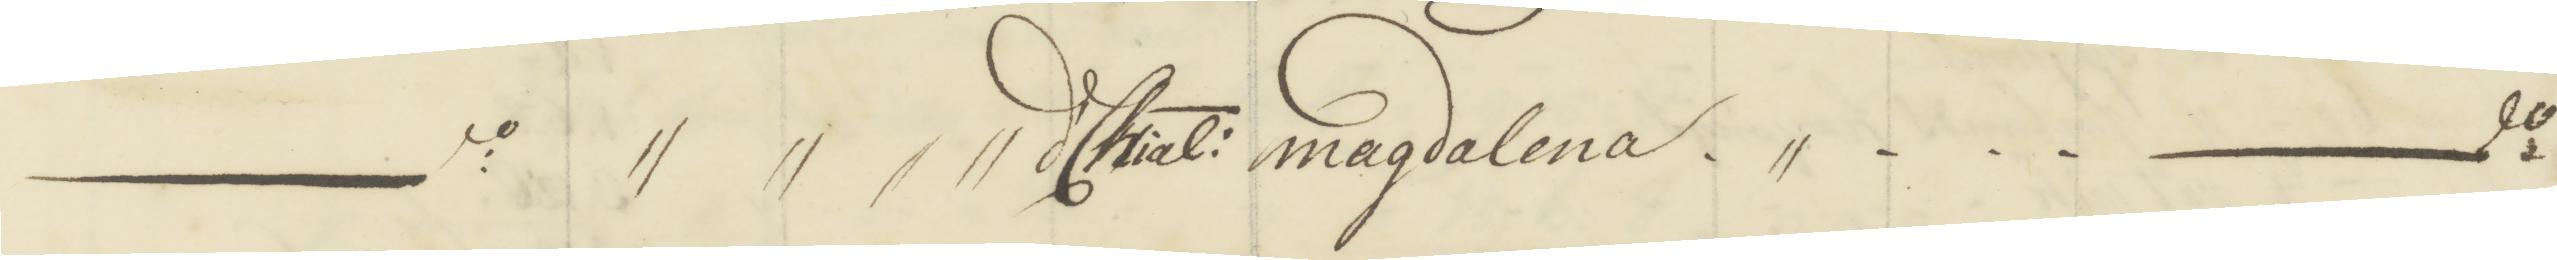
_:o „ „ „ „ d'Chial: magdalena. „ - - - _:o
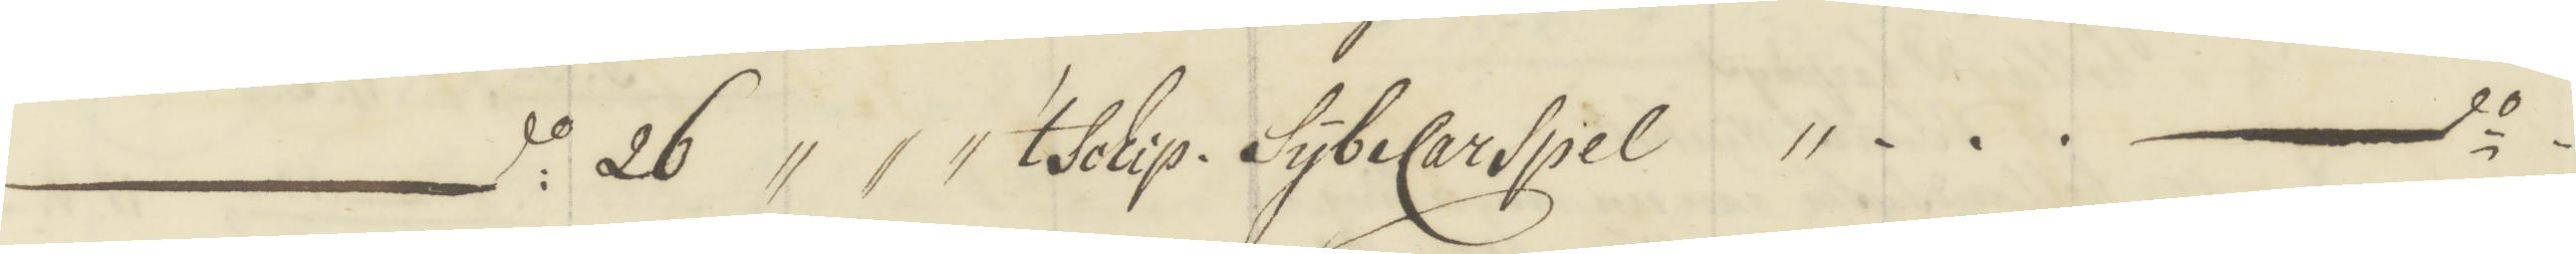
_:o 26 „ „ „ 'tschip Sijbecarspel „ - . . _=o -
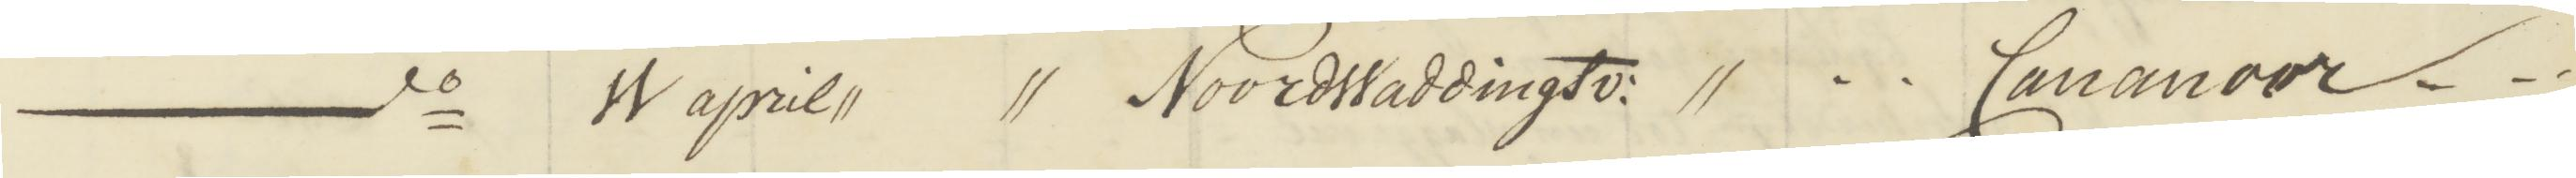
_=o 11 april„ „ Noordwaddingsv: „ - - Cananoor - - -
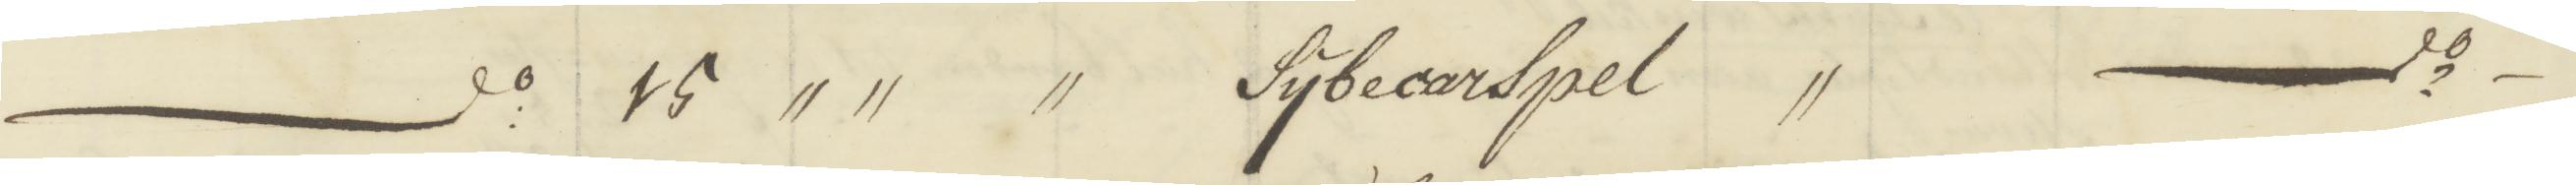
_:o 15 „ „ „Sijbecarspel „ _:o —
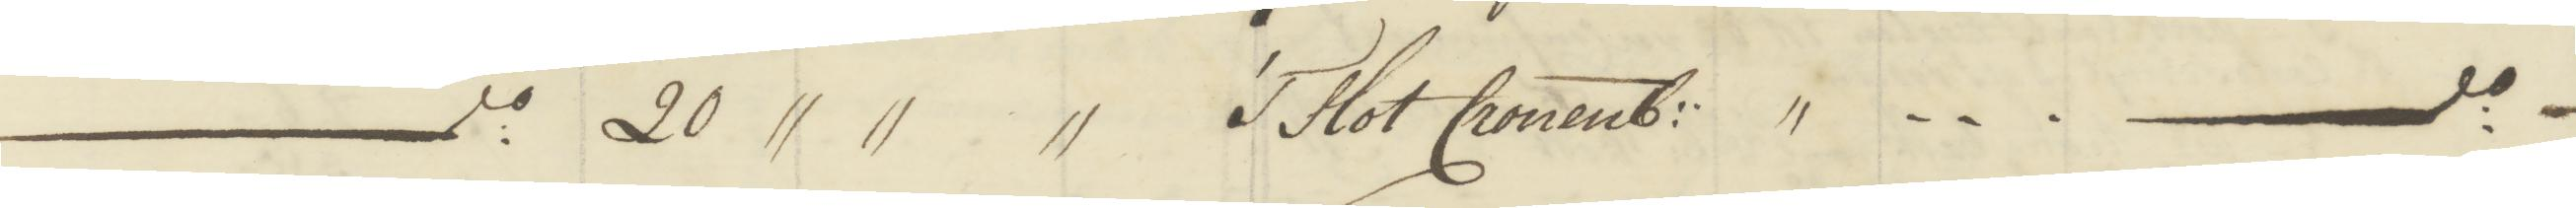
_:o 20 „ „ „ 'T slot Cronenb:. „ - - . _:o
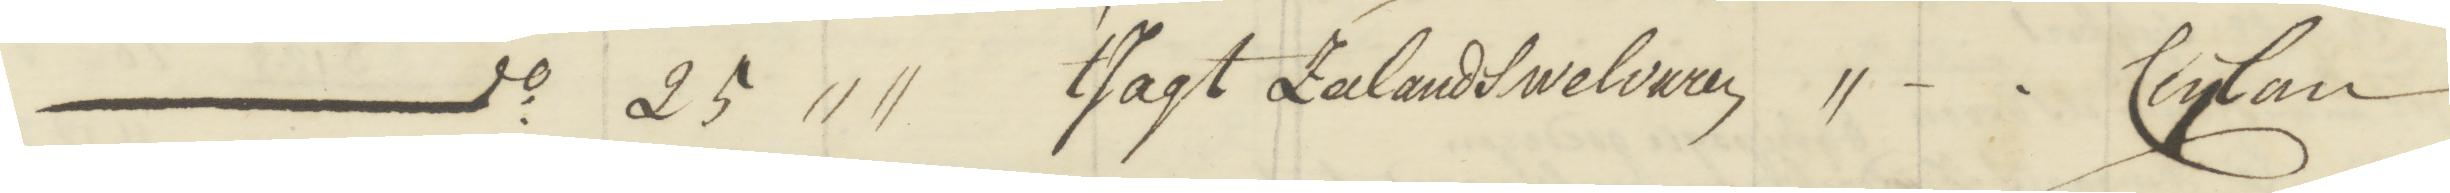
_:o 25 „ „ 'tJagt Zeelandswelvaren „ - - Ceijlon
